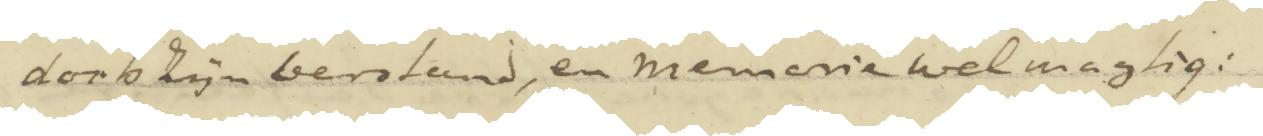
doch zijn verstand, en memorie wel magtig:
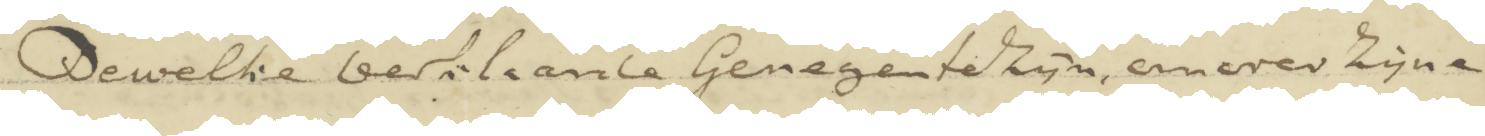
Dewelke verklaarde Genegen te zijn, en over zijne
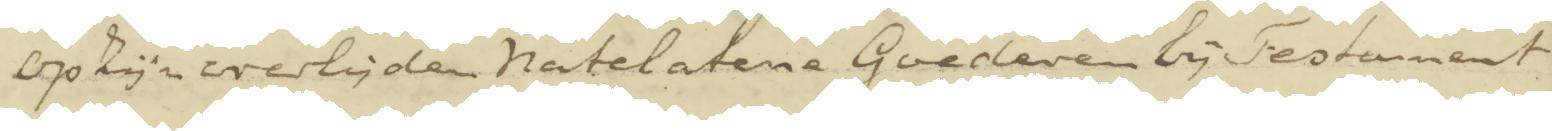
op zijn overlijden natelaten Goederen bij Testament
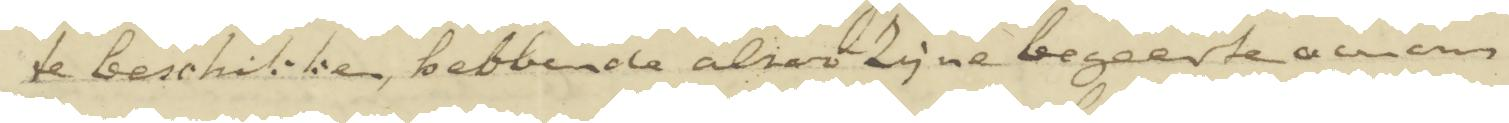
te beschikken, hebbende alzoo zijne begeerte aan ons
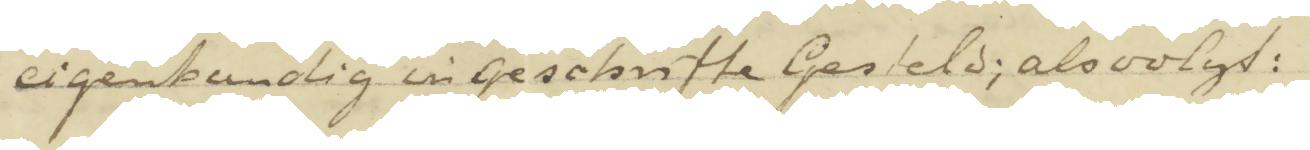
Eigenkundig in geschrifte gesteld; als volgt:
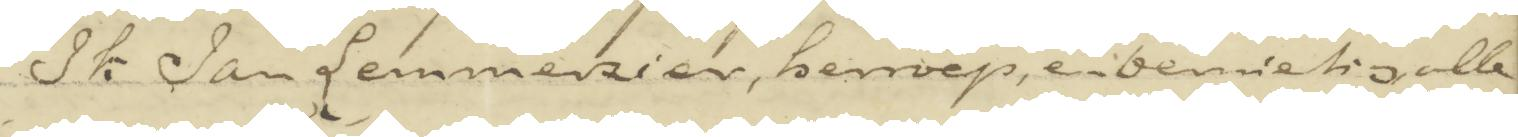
Ik Jan Lemmerzier, herroep, en vernietig, alle
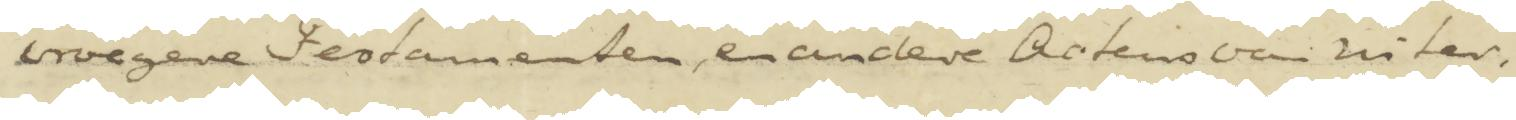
vroegere Testementen, en andere Actens van uiter,
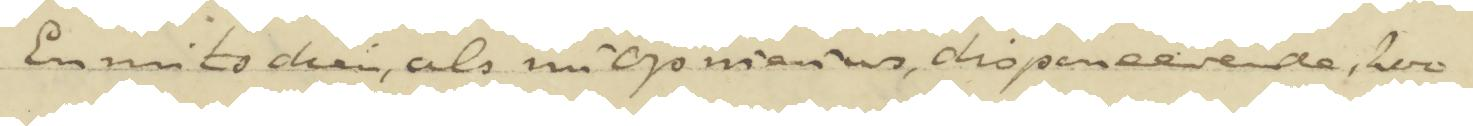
En mits dien, als nu opnieuw, disponeerende, zoo
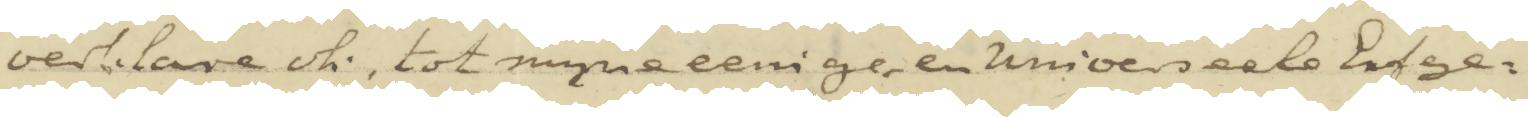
verklare ik, tot myne eenige, en universeele Erfge=
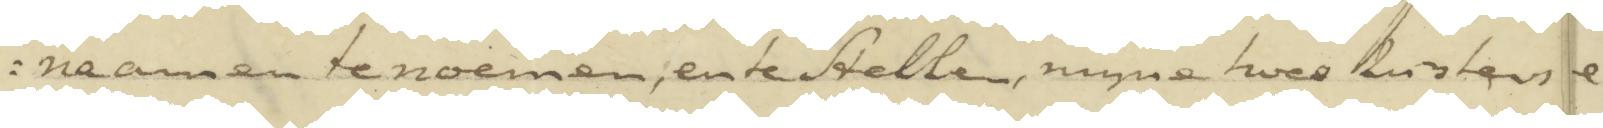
„naamen te noemen, en te stellen, myne twee zusters
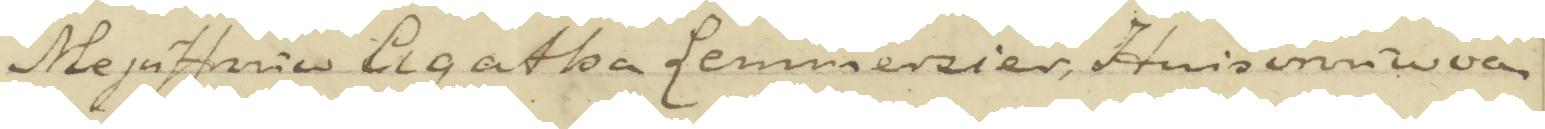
Mejuffrouw Agatha Lemmerzier, Huisvrouw van
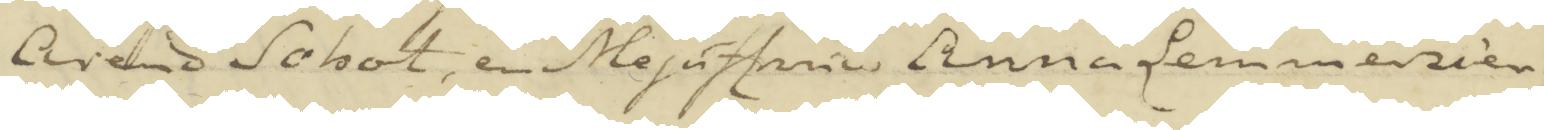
Arend Schot, en Mejuffrouw Anna Lemmerzier
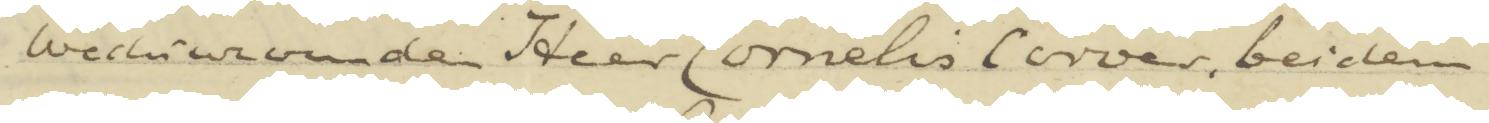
weduwe van den Heer Cornelis Corver, beiden
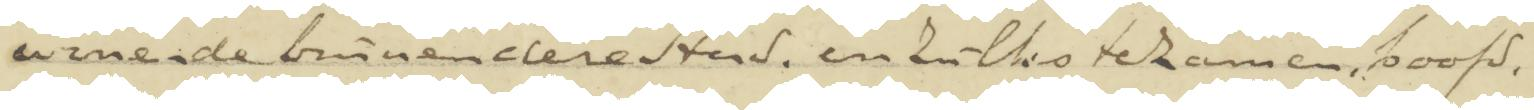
wonende binnen deze stad, en zulks tezamen en, hoofd
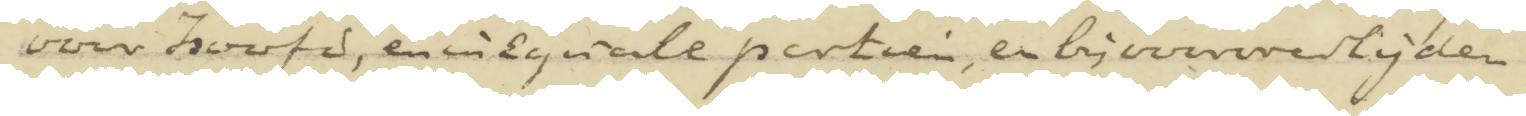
voor hoofd, en in Equale portien, en bij vooroverlijden
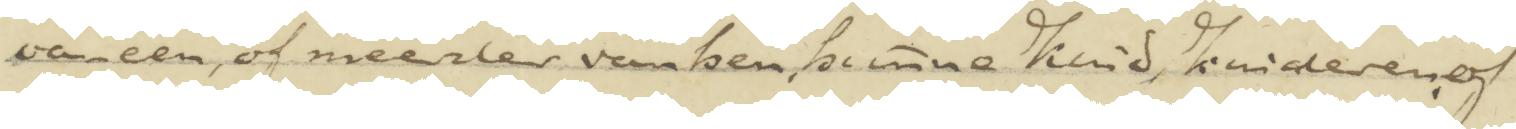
van een, of meerder van hen, hunne Kind, Kinderen, of
